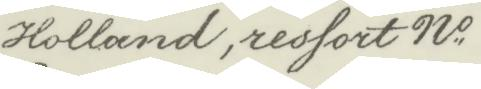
Holland, ressort N„o
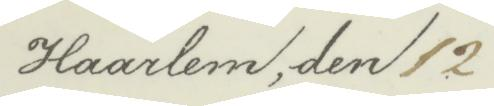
Haarlem, den 12
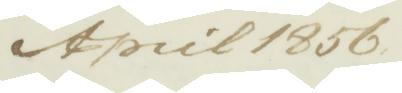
April 1856
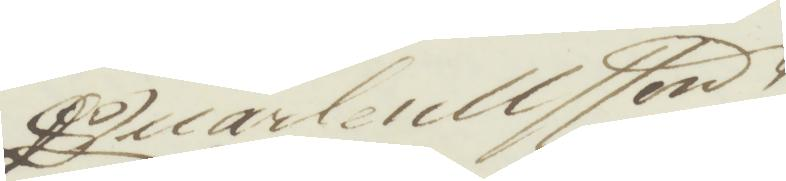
JQuarlesvUfford
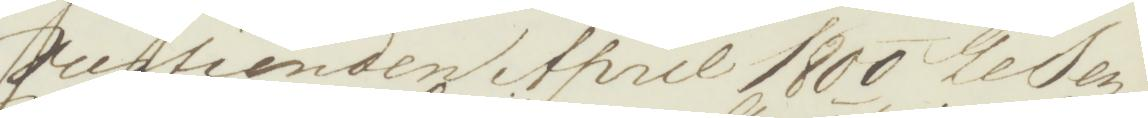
Veertienden April 1800 zes en
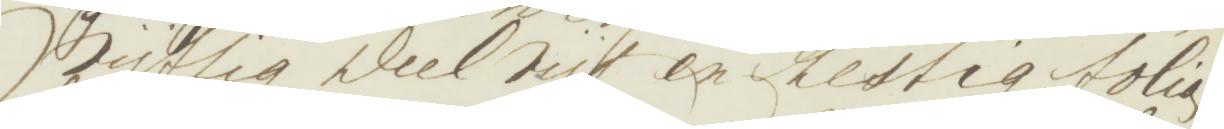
vijftig Deel vijf en zestig folio
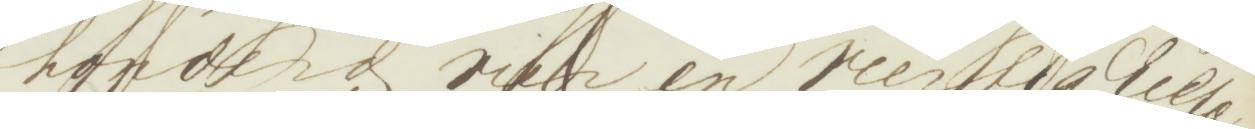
honderd vier en veertig recto,
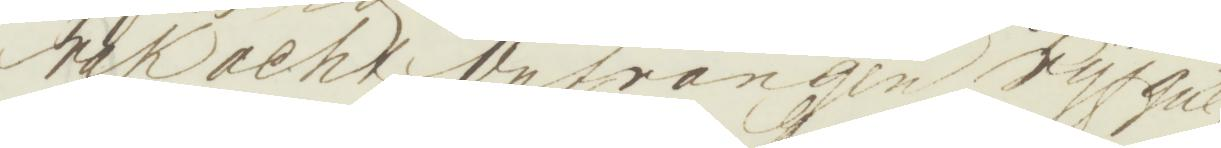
vak acht Ontvangen vijf gul
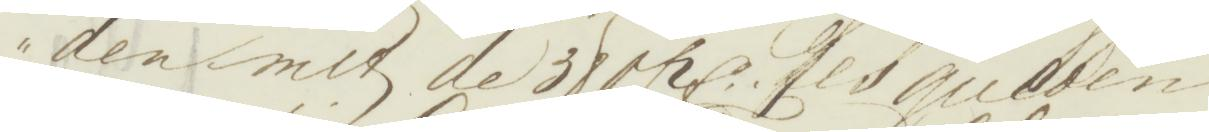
„den met de 38 opc.. Zes gulden
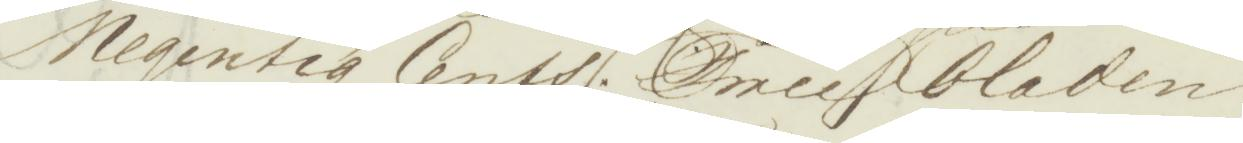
Negentig Cents: Twee bladen
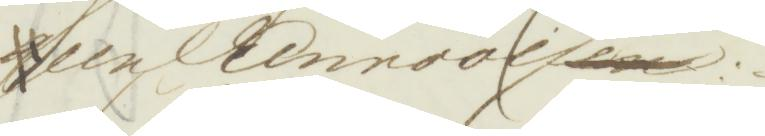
geen renvooijen:
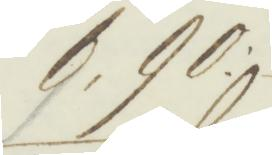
6,90:
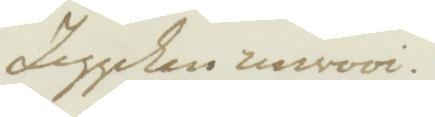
Zegge Een renvooi.
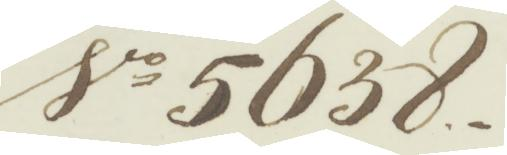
N=o 5638.-
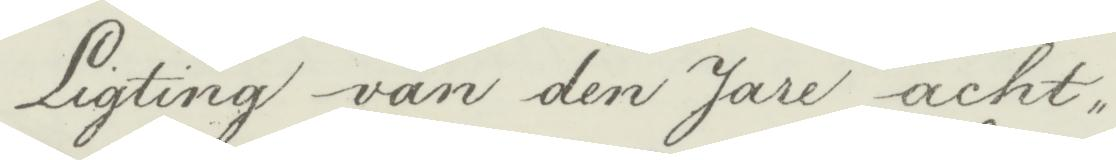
Ligting van den Jare acht„
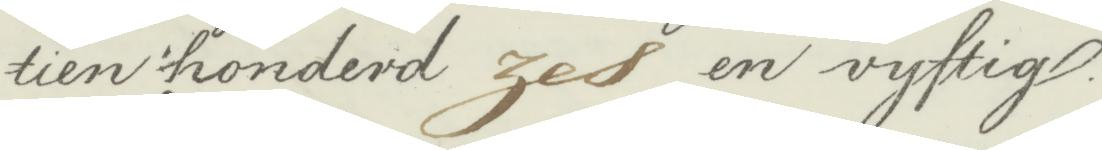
tien honderd zes en vyftig.
